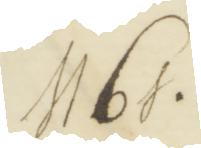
1161.
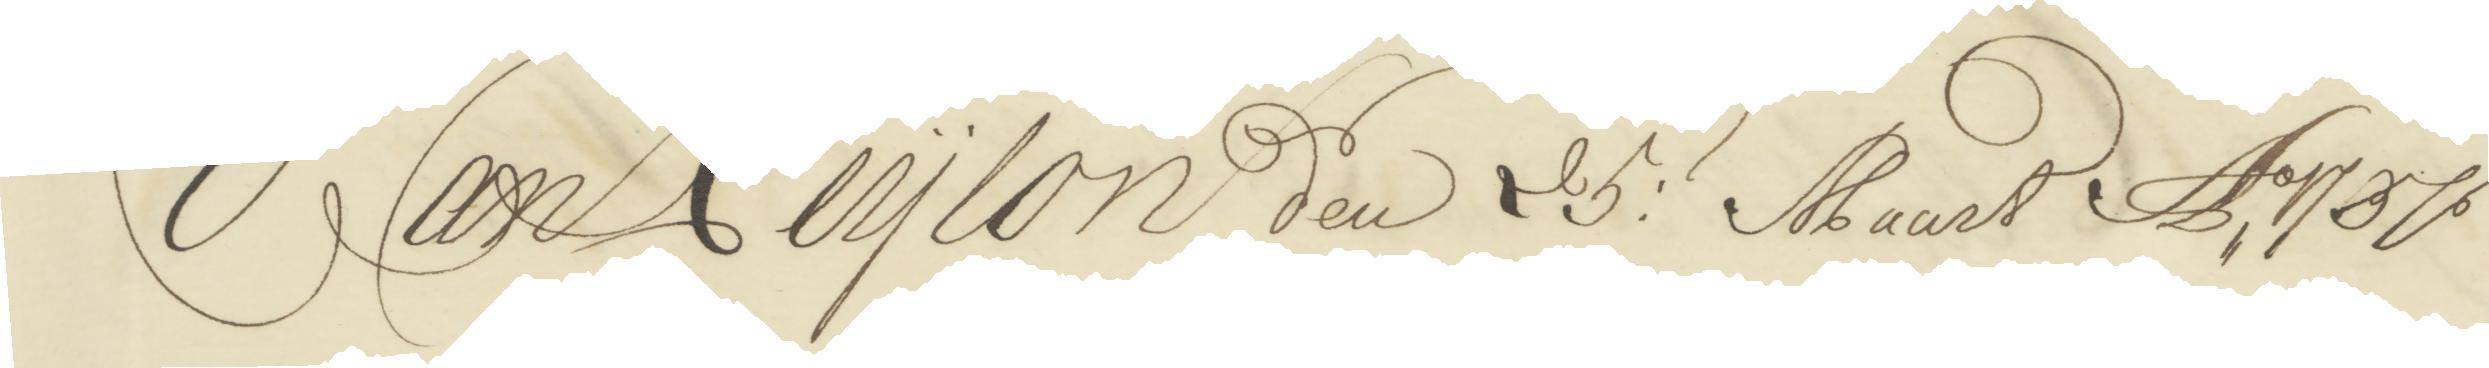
Van Ceijlon den 25:' Maart A„o 1737
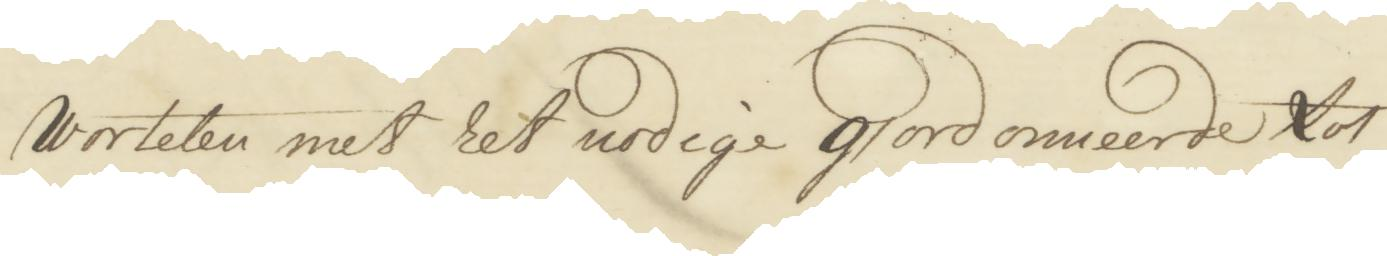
wortelen met het nodige g’ordonneerde tot
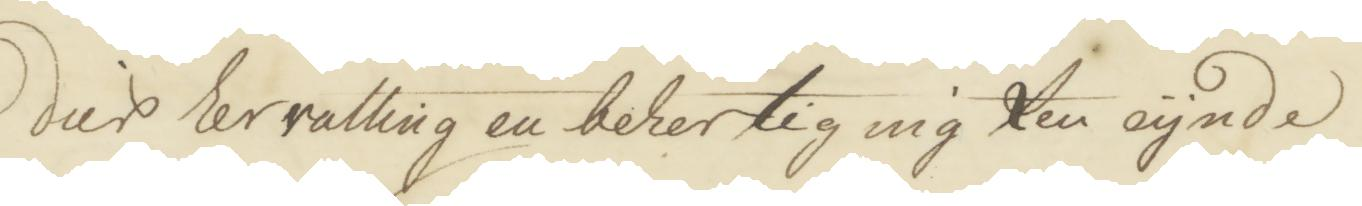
dier hervatting en behertiging ten eijnde
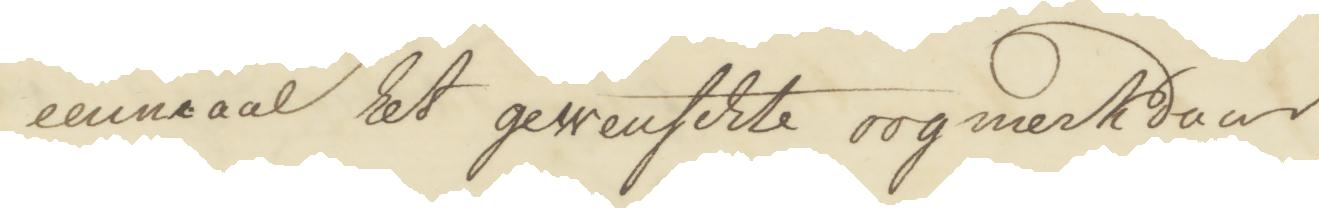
eenmaal het gewenschte oogmerk daar
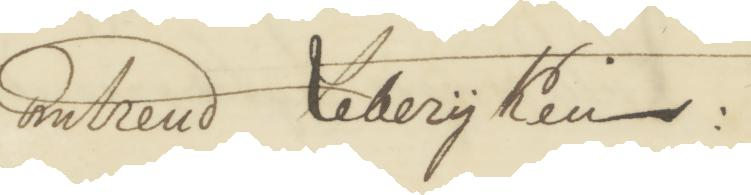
ontrend teberijken:
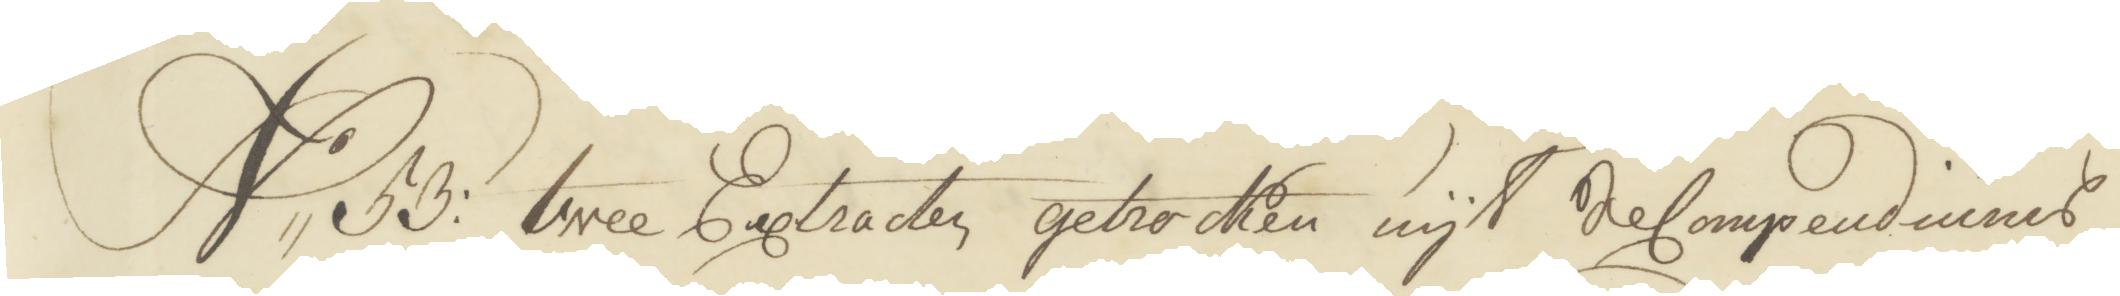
N„o 53: twee Extracten getrocken uijt de Compendiums
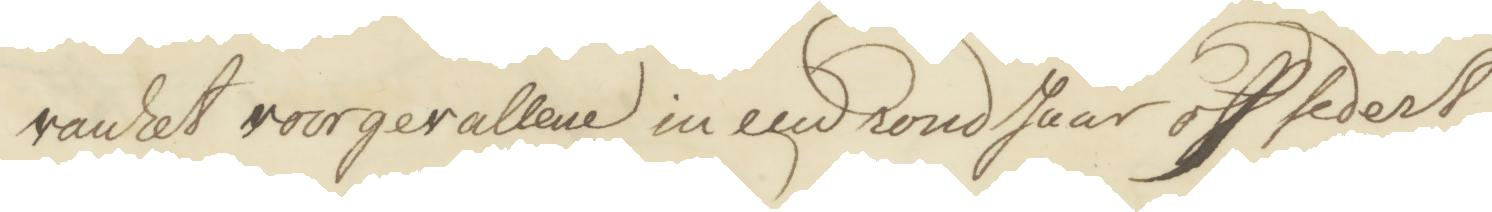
van het voorgevallene in een rond Jaar off sedert
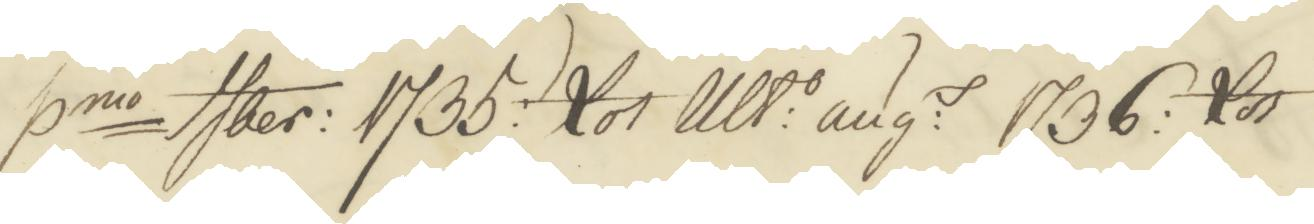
p=mo 7ber: 1735: tot Ult:o aug:s 1736: tot
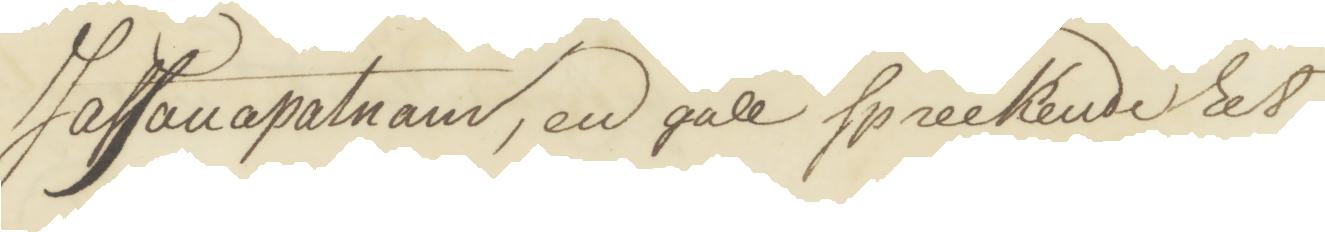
Jassanapatnam, en gale spreekende het
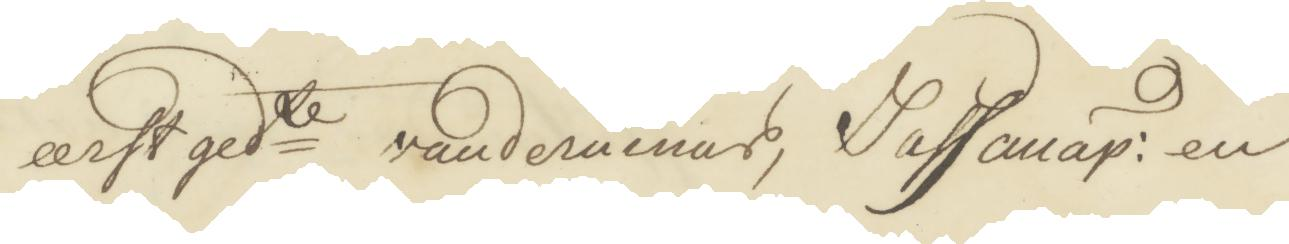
eerst ged=te van deruinas, Jassanap: en
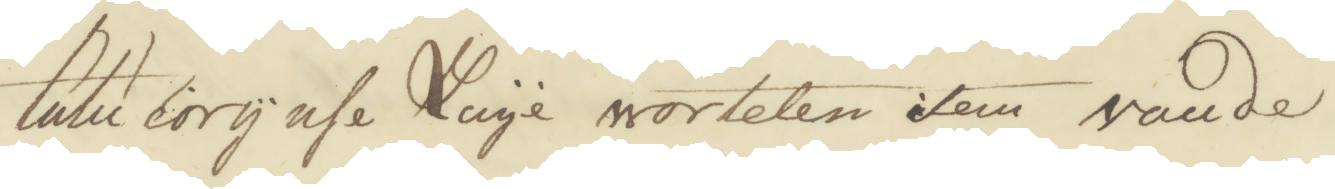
tutu corij ase zaije wortelen item van de
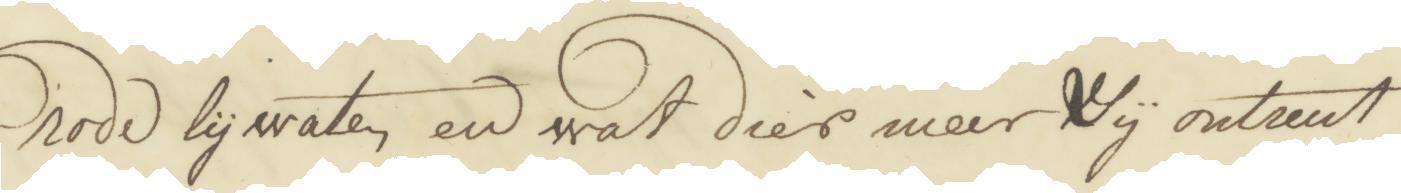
rode lijwaten en wat dies meer zij ontrent
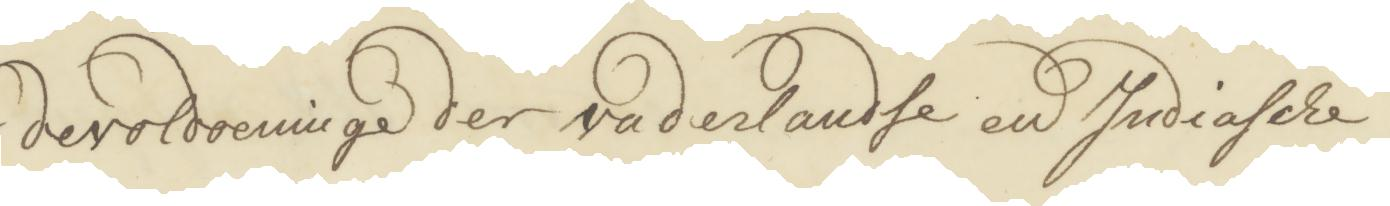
devoldoeninge der vaderlandse en Jndiasche
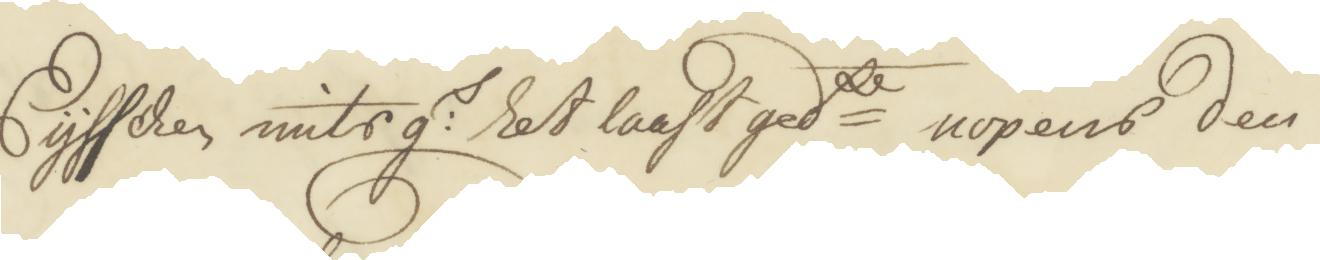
Eijsschen mitsg:s het laast ged=te nopens den
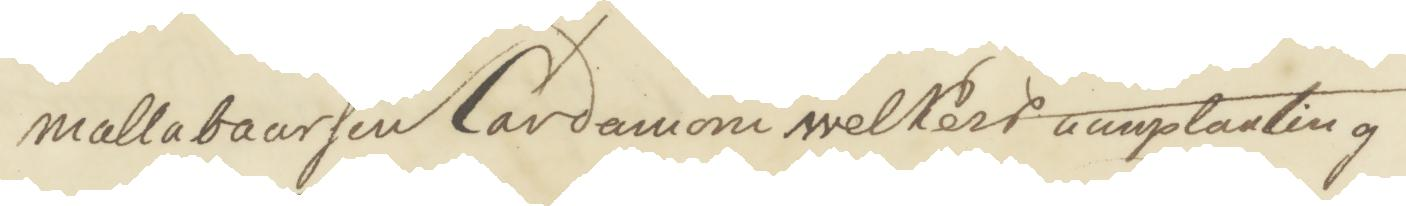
mallabaarsen Cardamom welkers aanplanting
